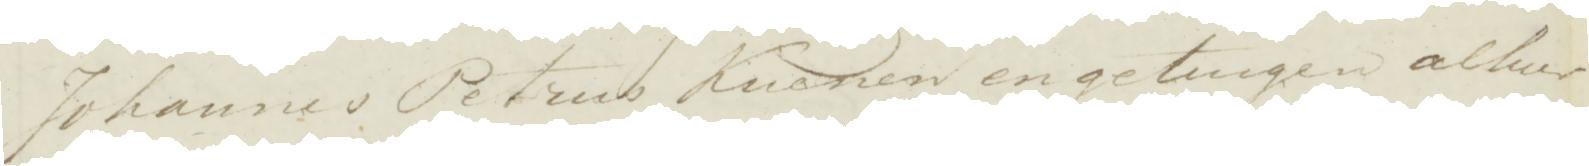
Johannes Petrus Kuenen en getuigen alhier
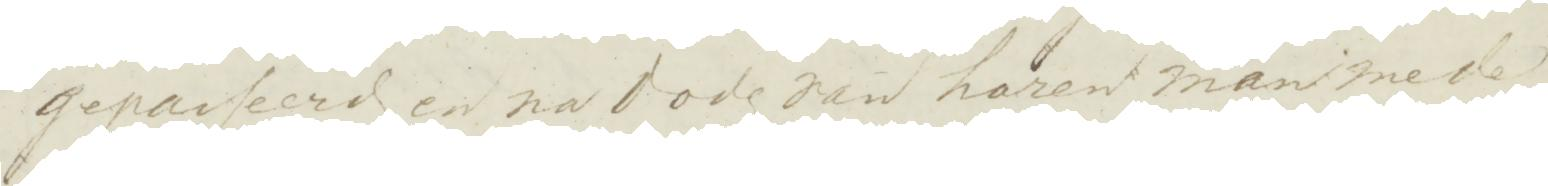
gepasseerd en na dode van haren man mede
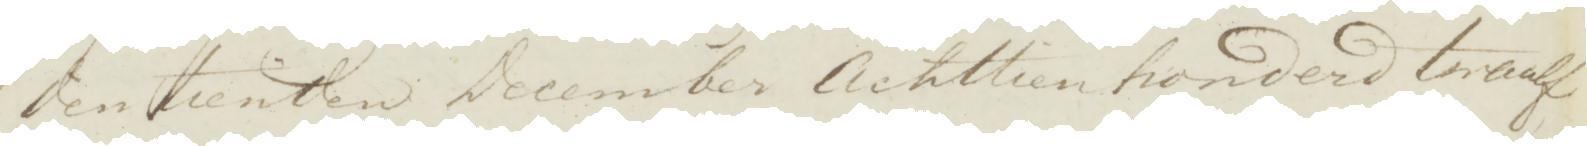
den tienden December Achttien honderd twaalf
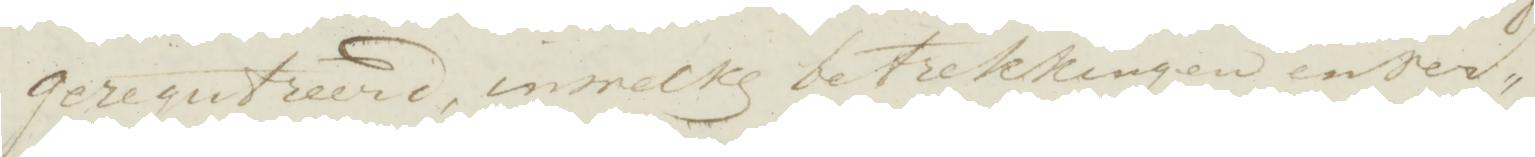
geregistreerd, in welke betrekkingen en ver„
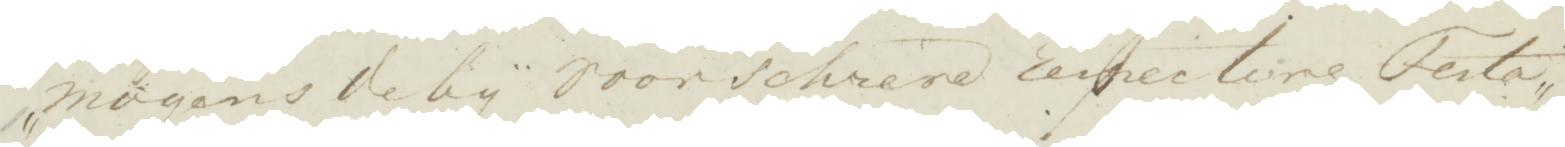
„mogens de bij voorschreve respective Testa„
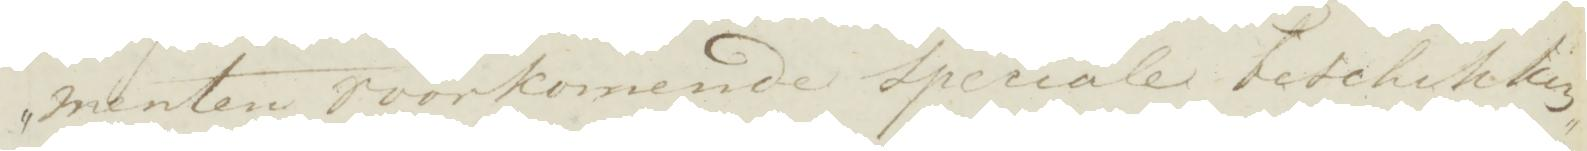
„menten voorkomende speciale beschikkin
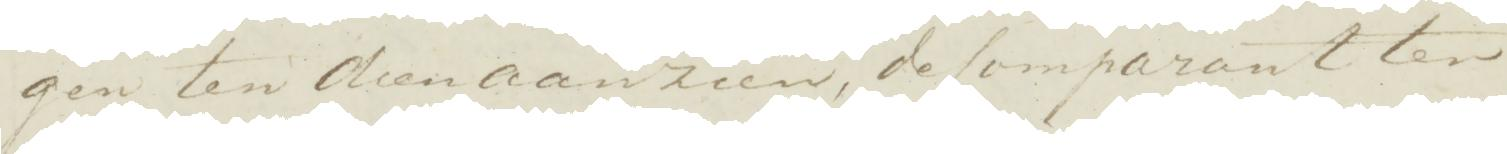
gen ten dien aanzien, de Comparant ter
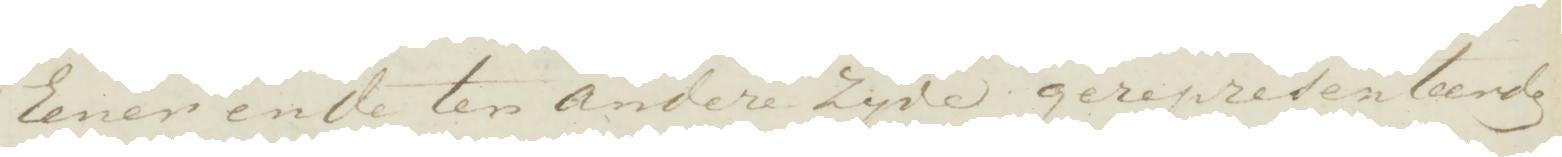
Eener ende ter andere zijde gerepresenteerde
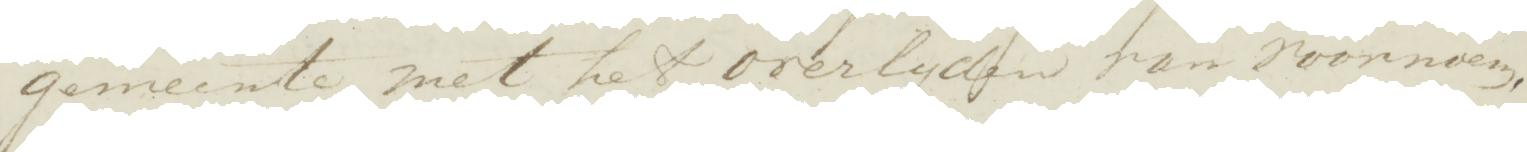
gemeente, met het overlyden van voornoem
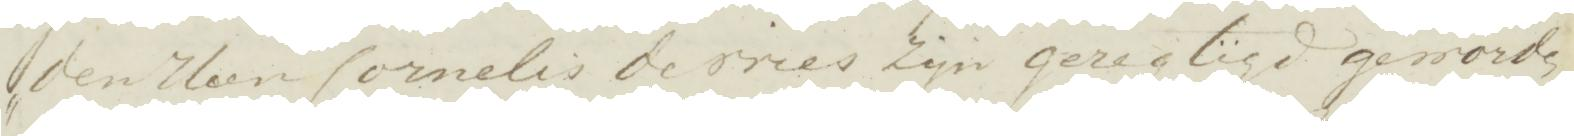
„den Heer Cornelis de vries zijn geregtigd geworden
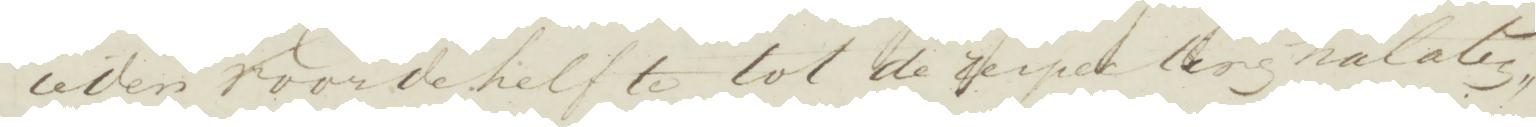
ieder voor de helfte tot de respective nalaten„
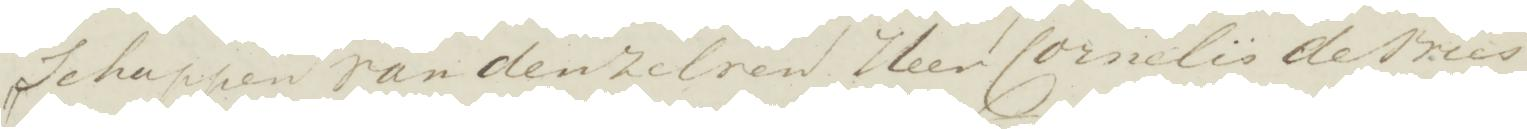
schappen van denzelven Heer Cornelis de Vries
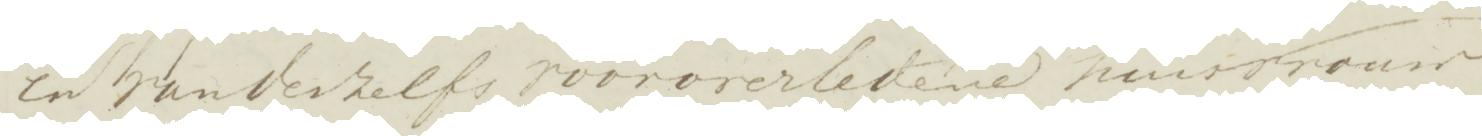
en van deszelfs vooroverledene huisvrouw
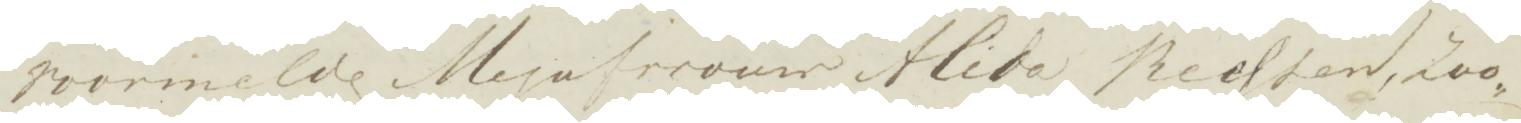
voormelde Mejufvrouw Alida Regten, zoo„
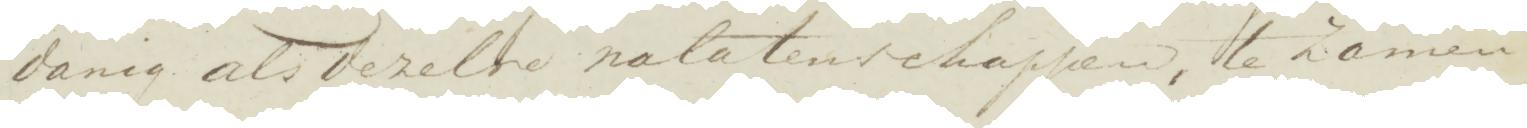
danig als dezelve nalatenschappen, te zamen
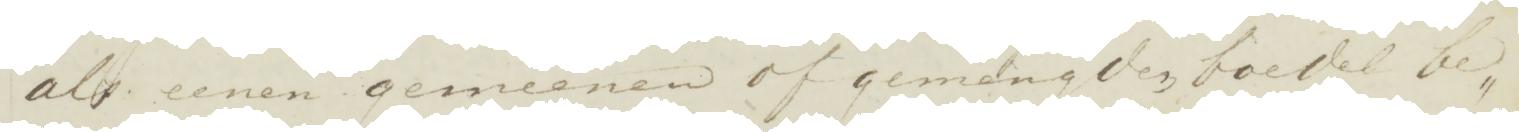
als eenen gemeenen of gemengden boedel be„
